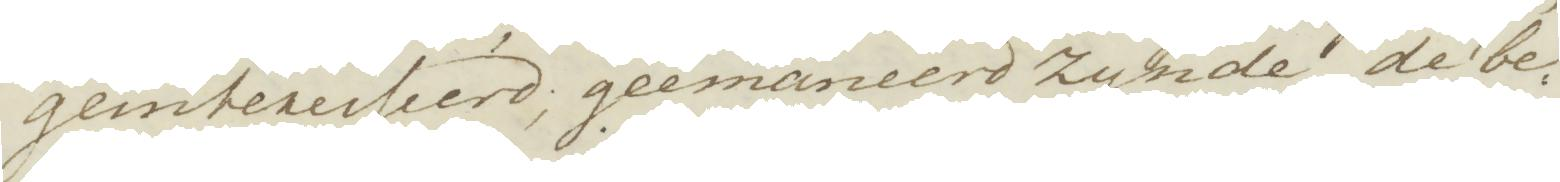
geinteresseerd, geëmaneerd zynde, de be„
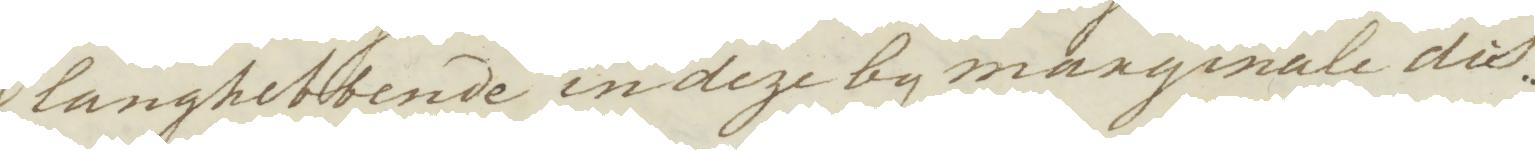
=langhebbende in deze by marginale dis„
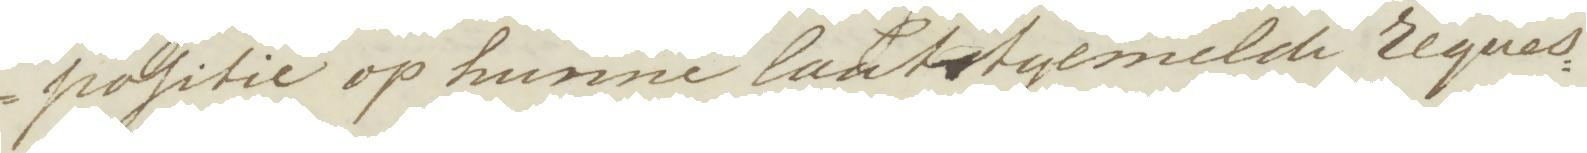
=positie op hunne laatstgemelde reques=
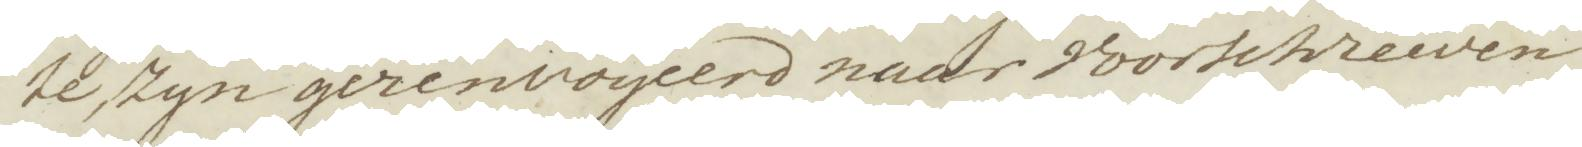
=te, zyn gerenvoyeerd naar voorschreeven
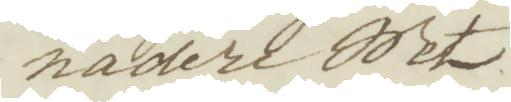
nadere Wet
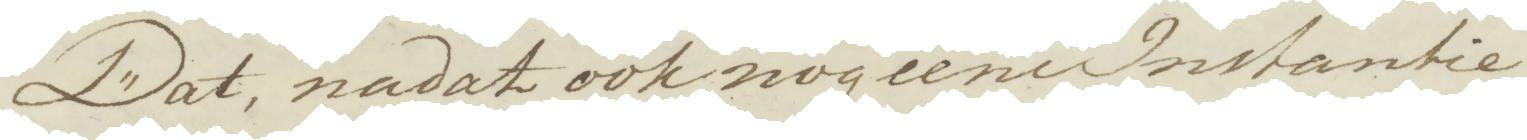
Dat, nadat ook nog eene Instantie
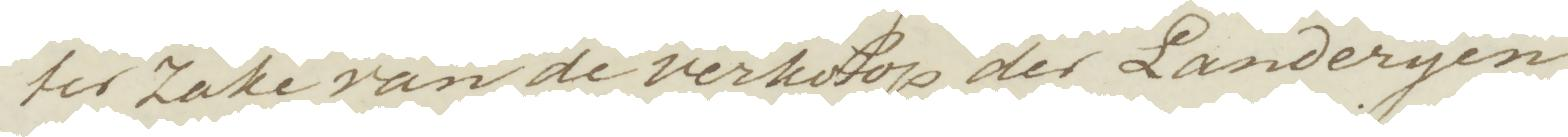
ter zake van de verkoop der Landeryen
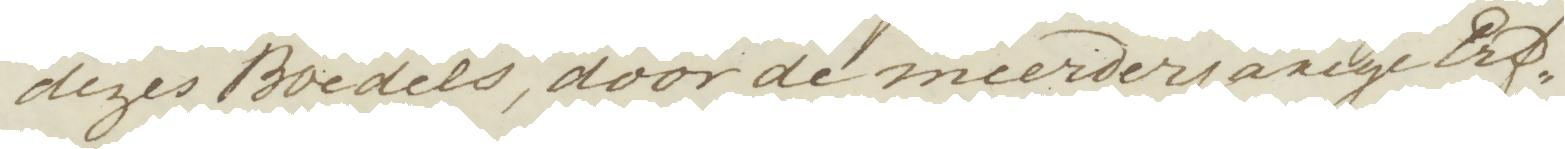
dezes Boedels, door de meerderjarige Erf„
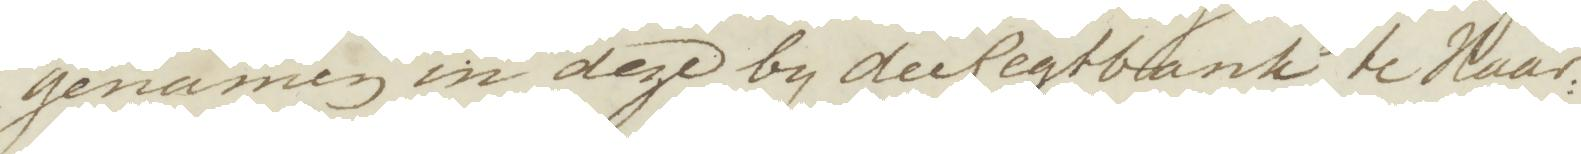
=genamen in deze by de Regtbank te Haar=
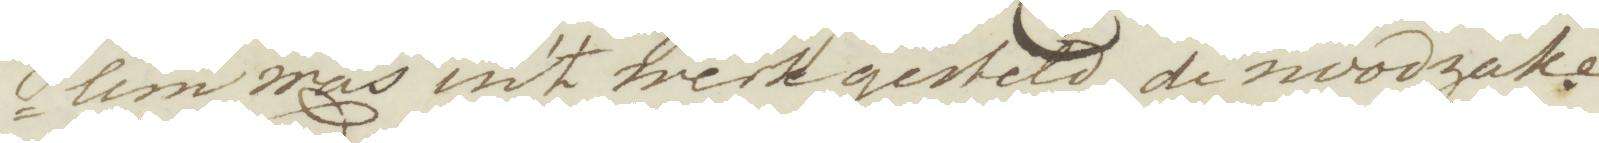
=lem was in’t werk gesteld, de noodzake=
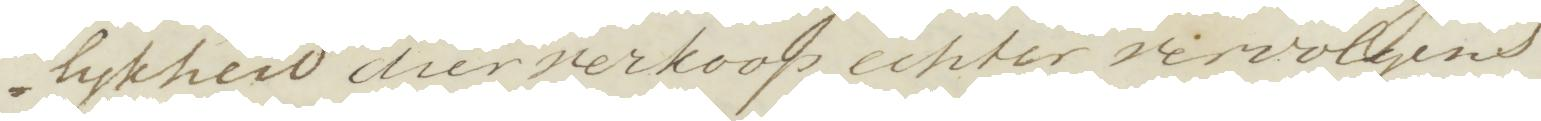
=lykheid dier verkoop echter vervolgens
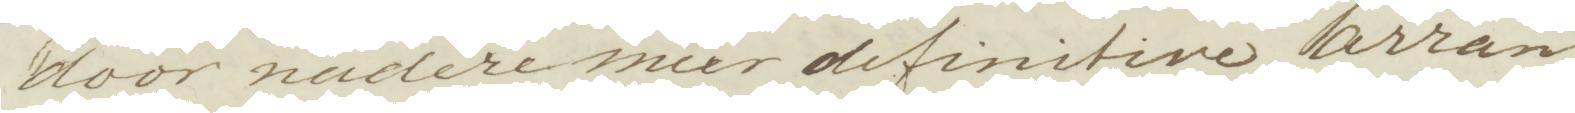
door nadere meer definitive arran:
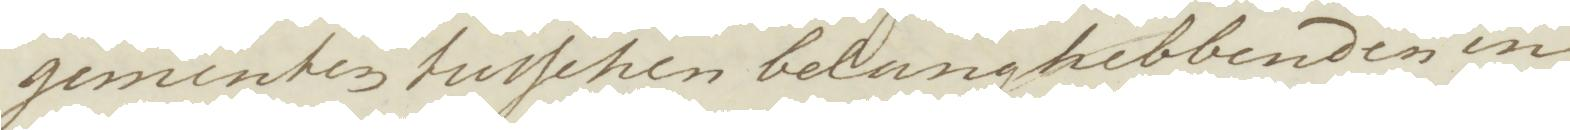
=gementen tusschen belanghebbenden in
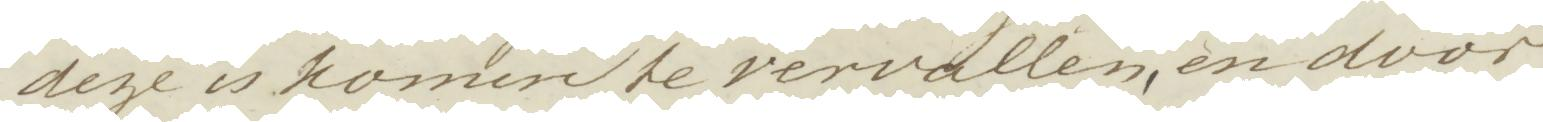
deze is komen te vervallen, en door
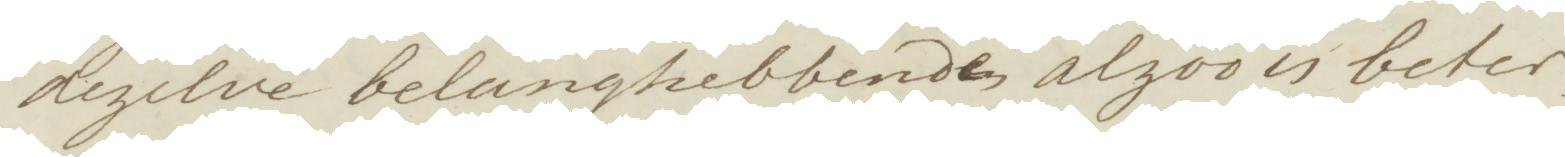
dezelve belanghebbenden alzoo is beter
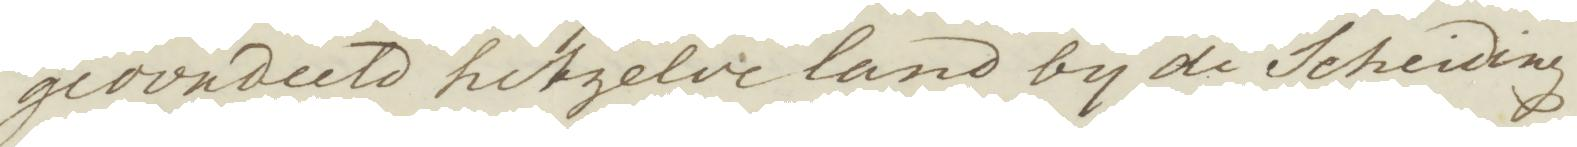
geoordeeld hetzelve land by de scheiding
